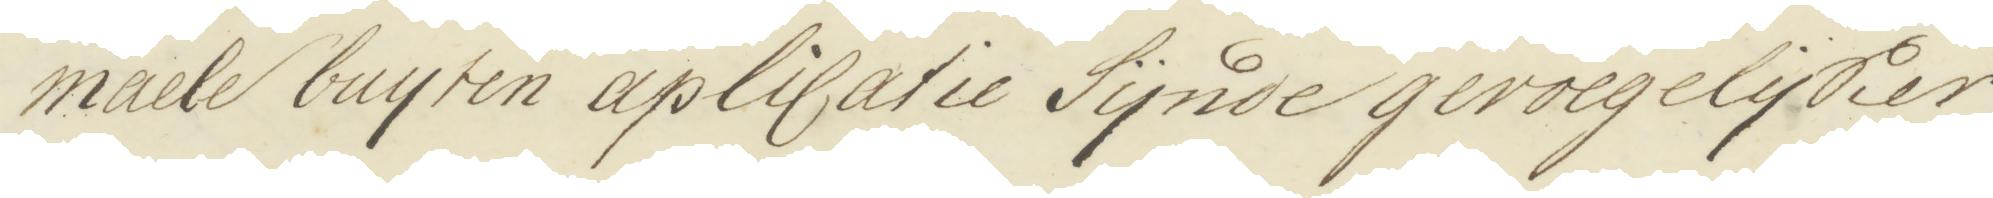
maele buyten aplicatie sijnde gevoegelijker
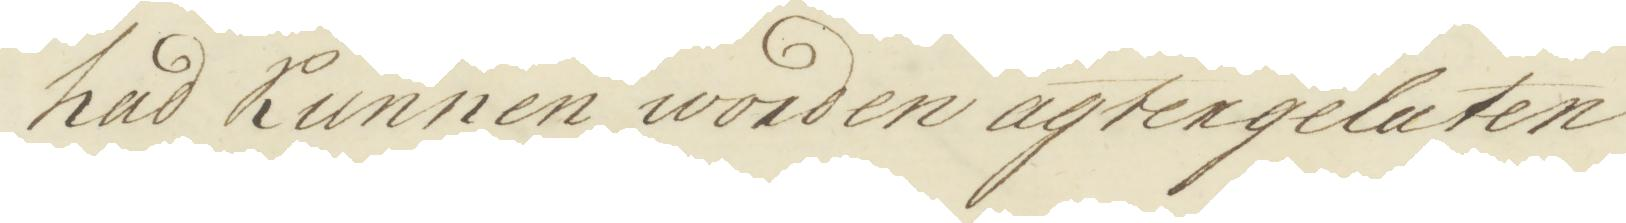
had kunnen worden agtergelaten
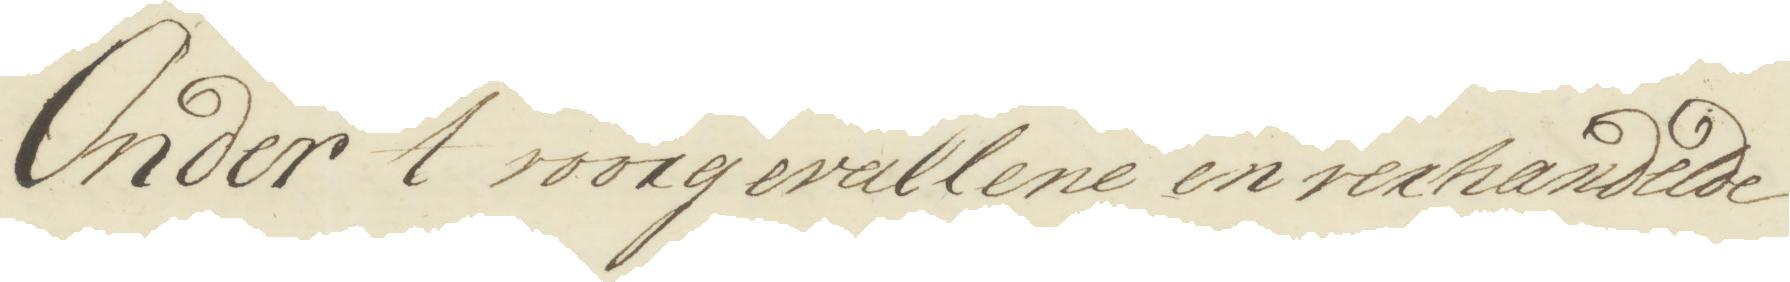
Onder t voorgevallene en verhandelde
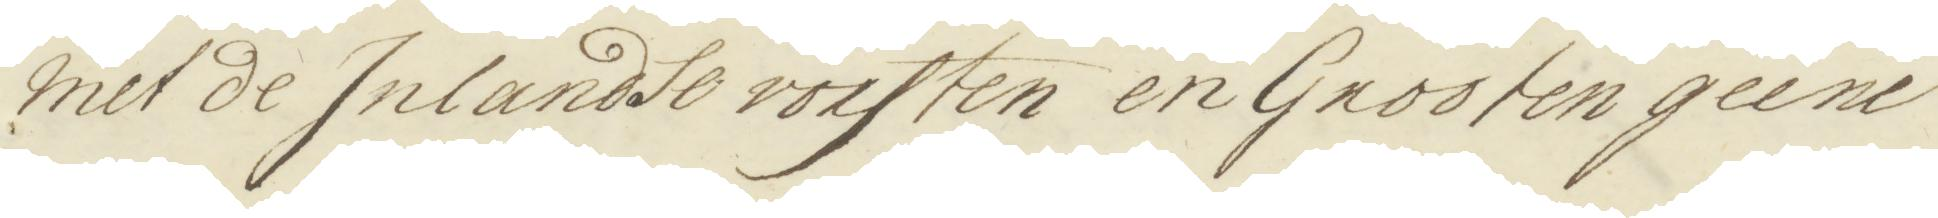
met de Jnlandse vorsten en Grooten geene
